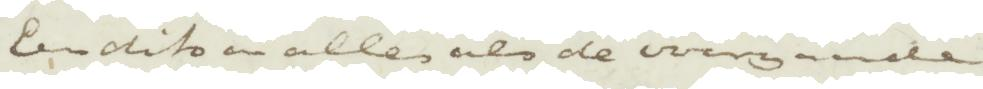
Een dito in alles als de voorgaande
